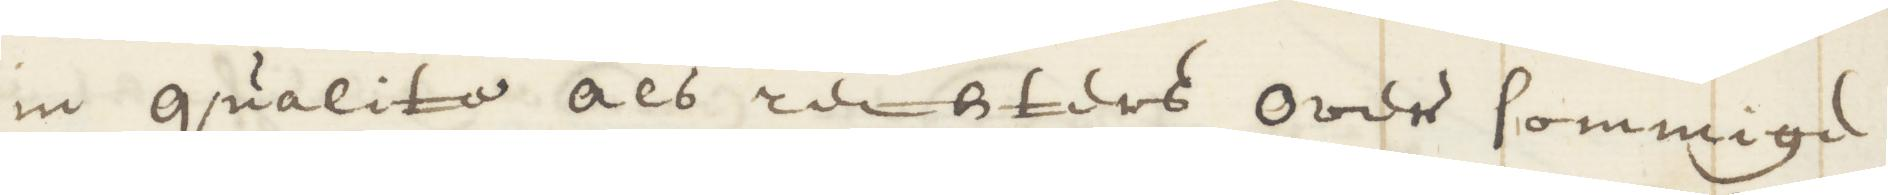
in qualite als rechters over sommige
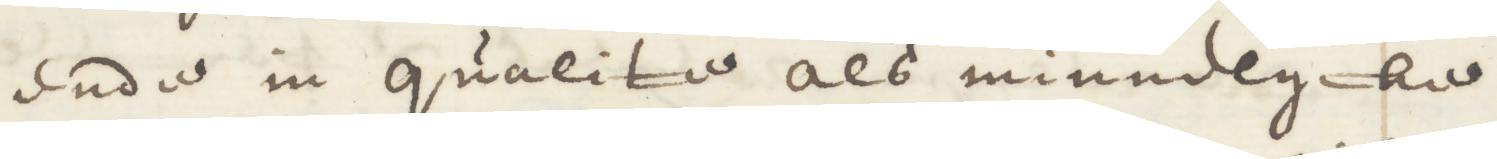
ende in qualite als minnelijcke
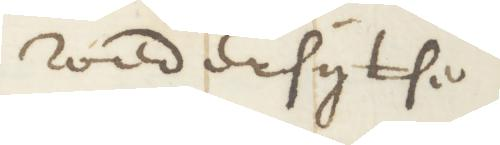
wedersijtse
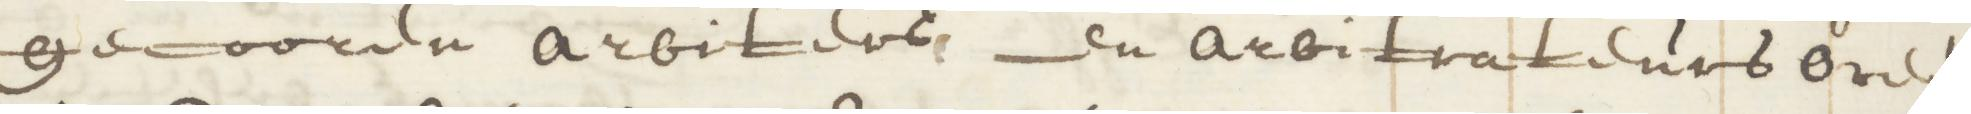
gecooren arbiters en arbitrateurs over
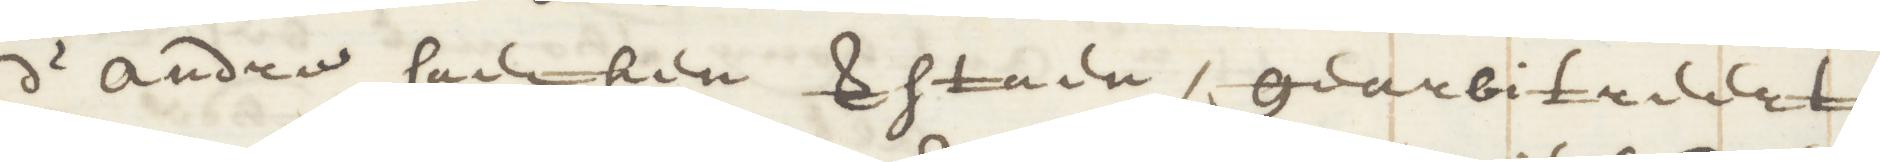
d’ andre saecken verstaen, gearbitreert
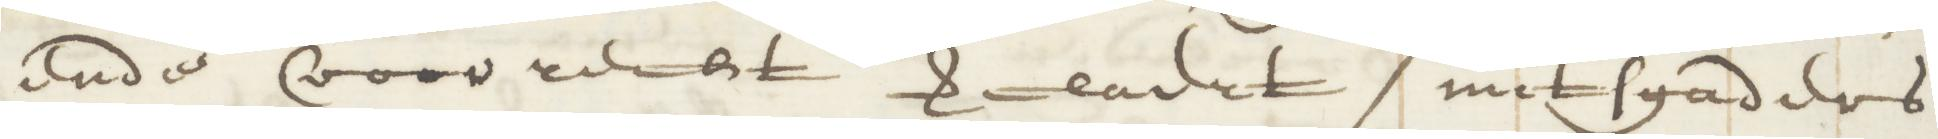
ende voor recht verclaert, mitsgaders
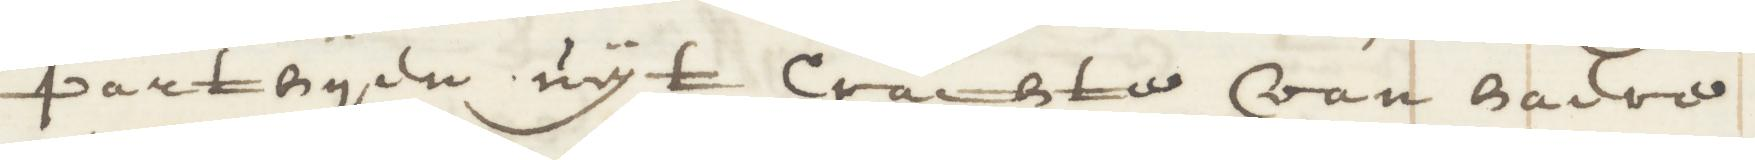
parthijen uijt Crachte van haere
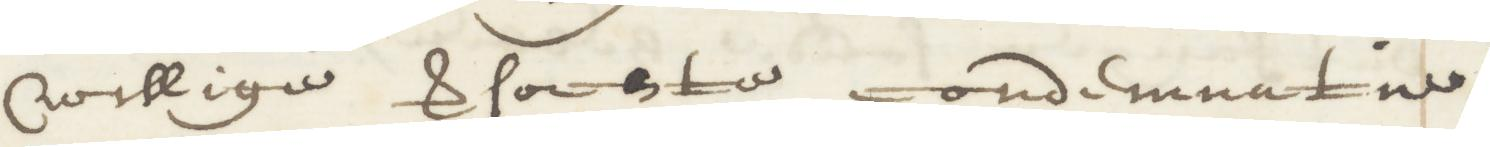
willige versochte condemnatie
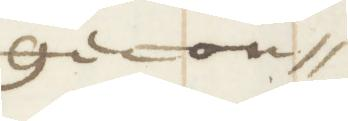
gecon„
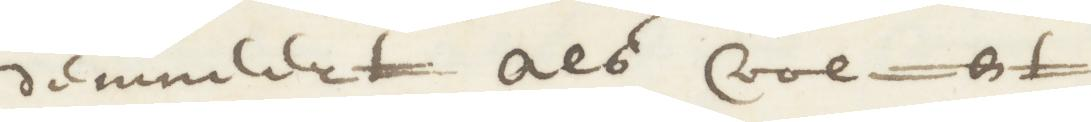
demneert als volcht
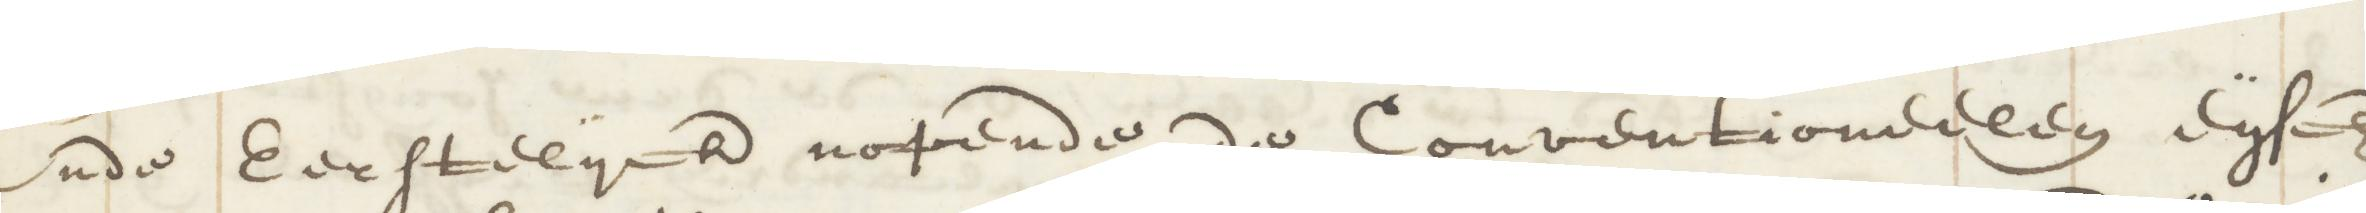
Ende Eerstelijck notende de Conventioneelen eijsch
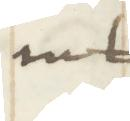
int
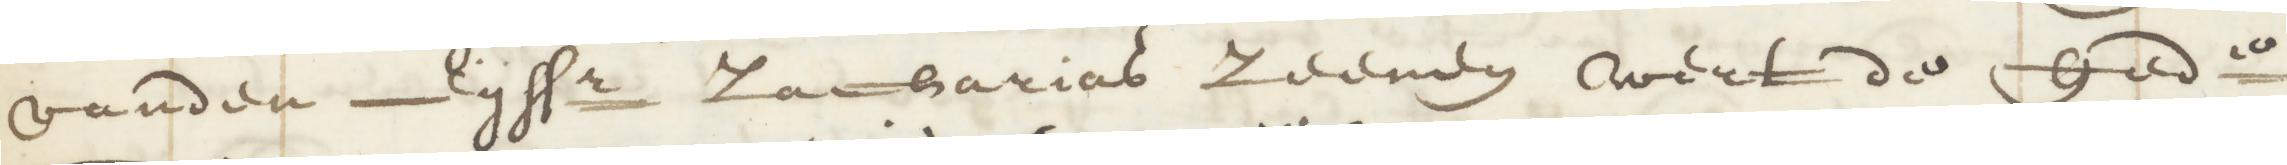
van den Eijss=r Zacharias Zeenen wert de ged=e
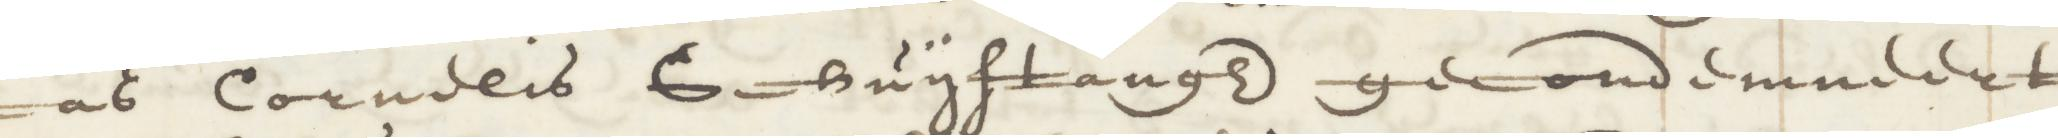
cas Cornelis Schuijftangh gecondemneert
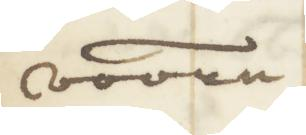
voorn
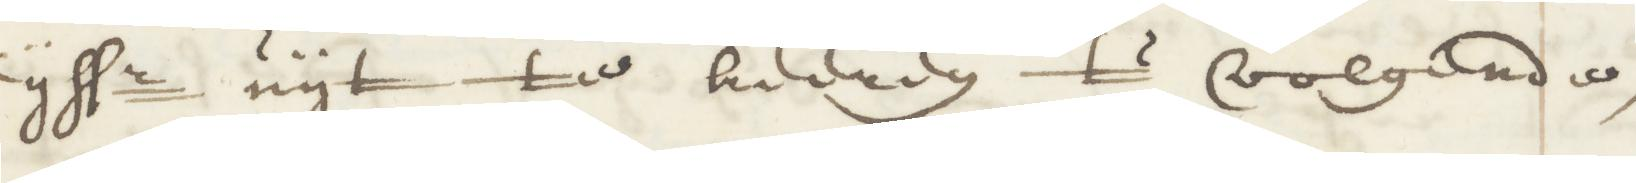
ijss=r uijt te keeren t' volgende
